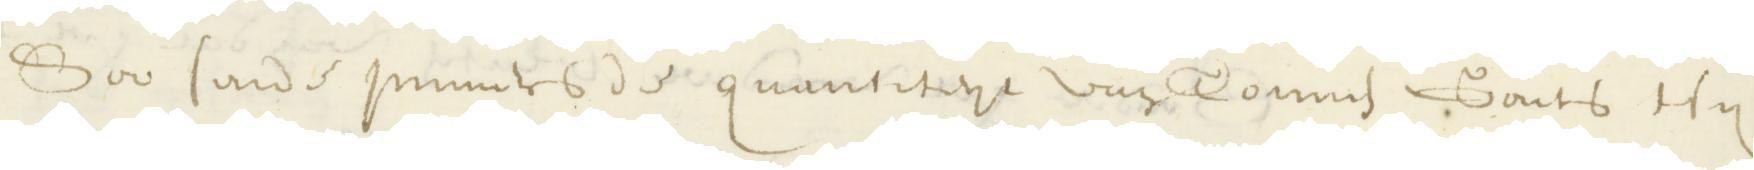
Soo sende Jmmers de quantiteyt van Tonnen souts tsy
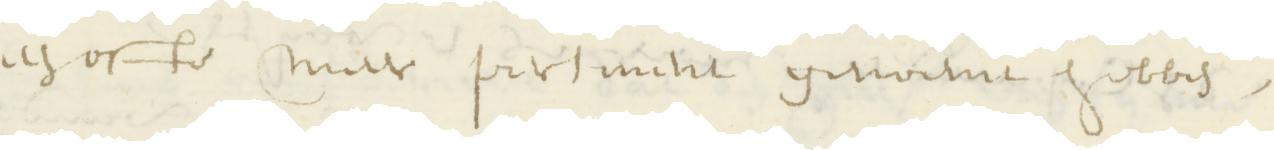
een ofte meer pertinent genoemt hebben,
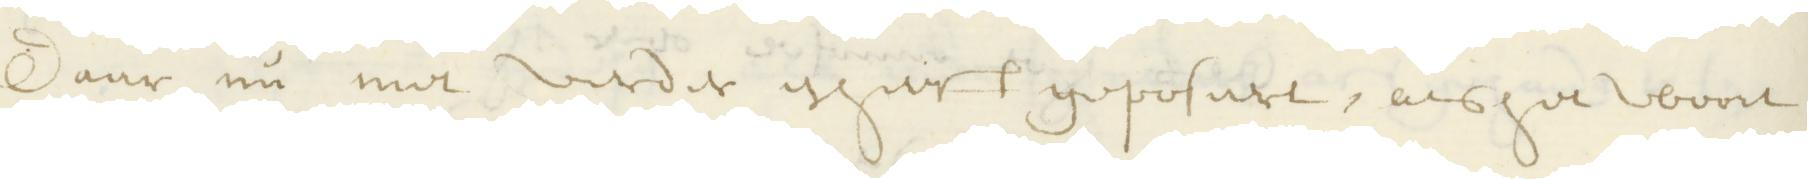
Daer nu niet verder en heeft geposeert, als het woort
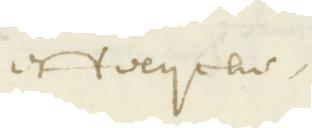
ettelycke,
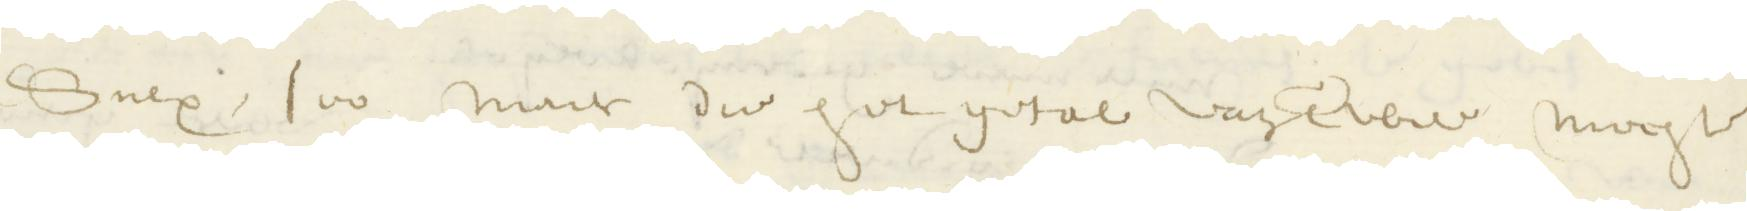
Sulx, soo meer die het getal van Twee mogte
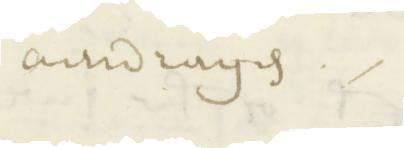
aendragen./
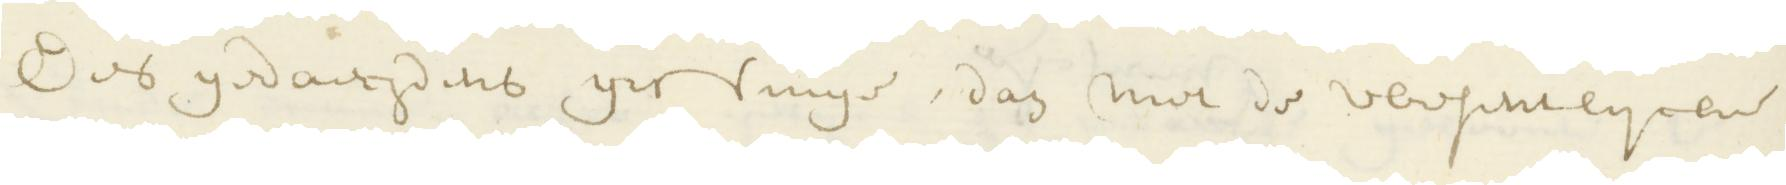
Des gedaegdens gissinge, dan met de wesentlycken
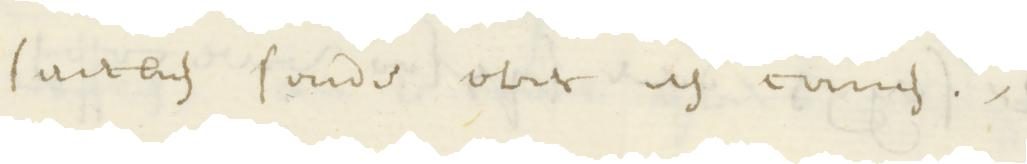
saecken soude over een comen./
